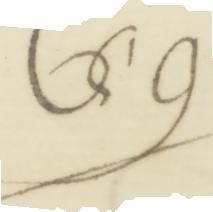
659
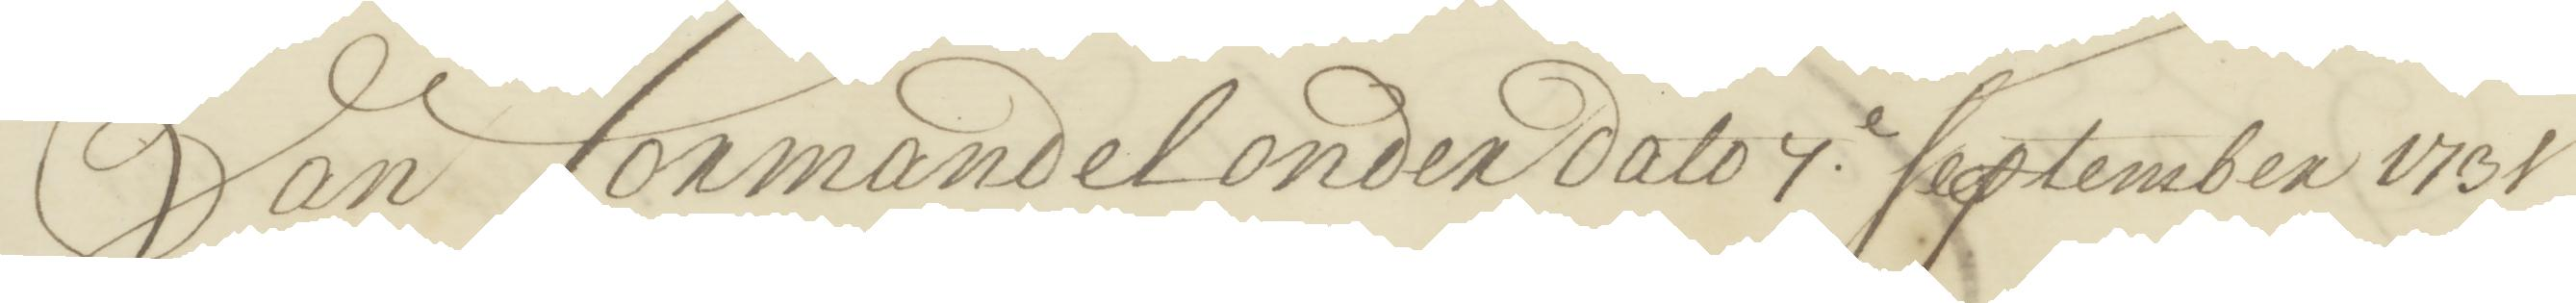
Van Cormandel onder dato 7.e september 1731
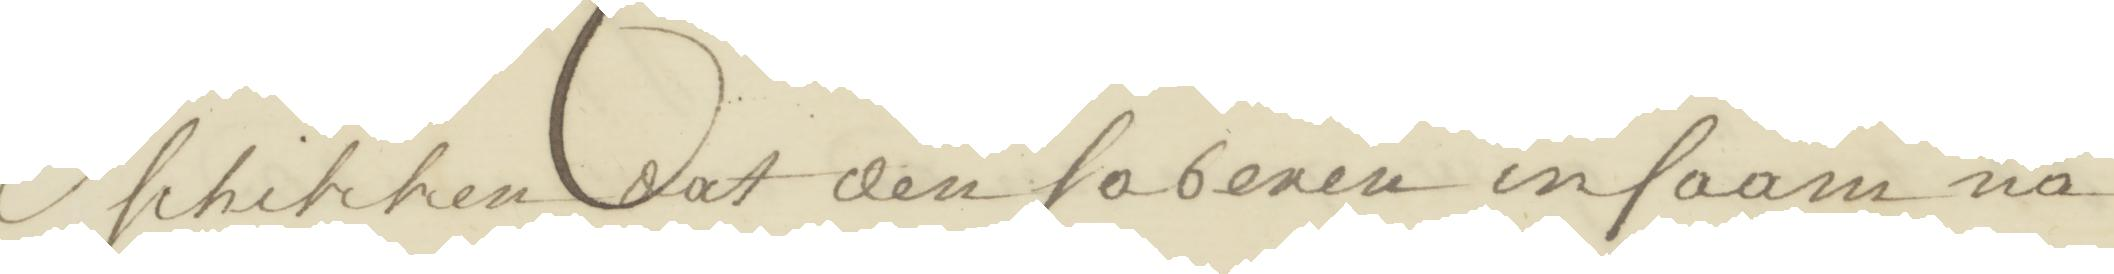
schikken, dat den soberen insaam na
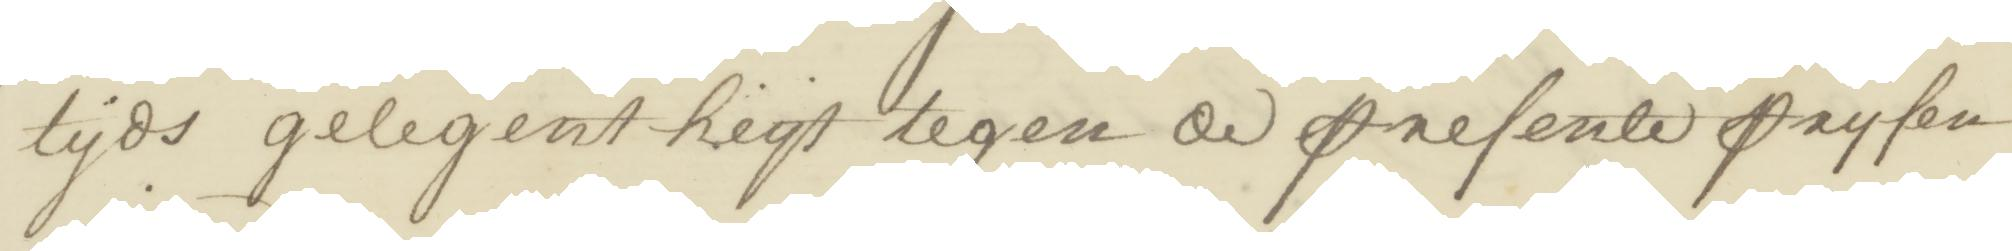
tijds gelegentheijt tegen de presente prijsen
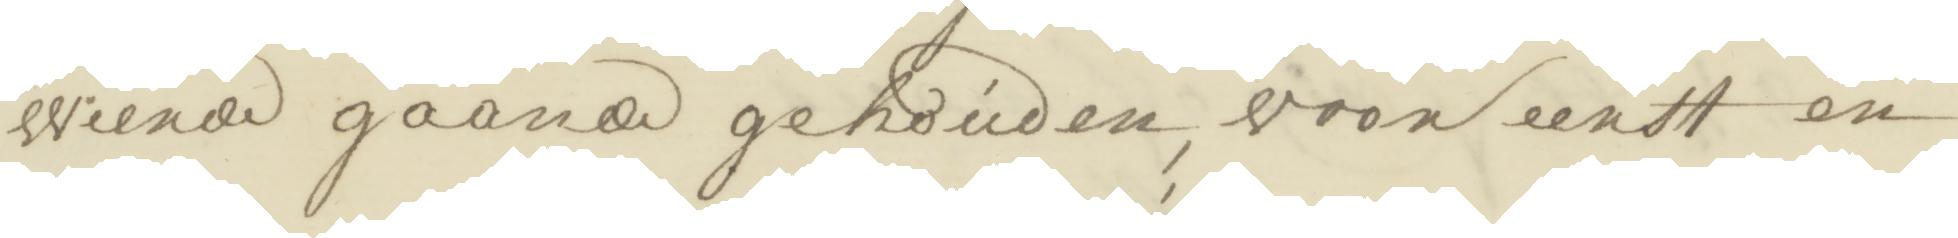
wierde gaande gehouden, voor eerst en
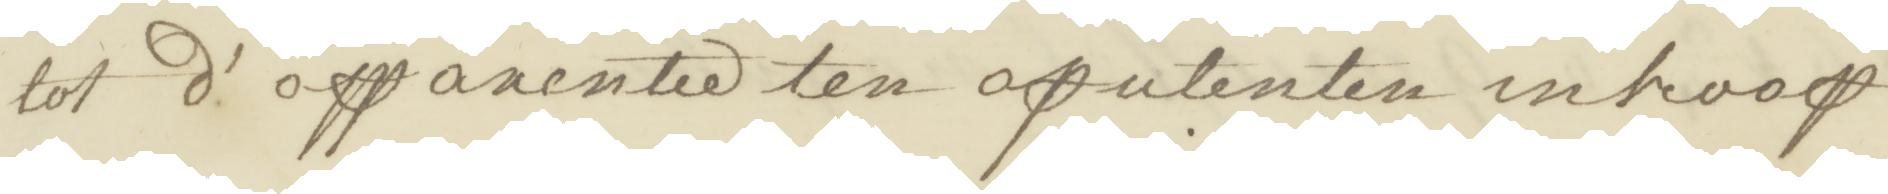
tot d'apparentie ten opulenten inkoop
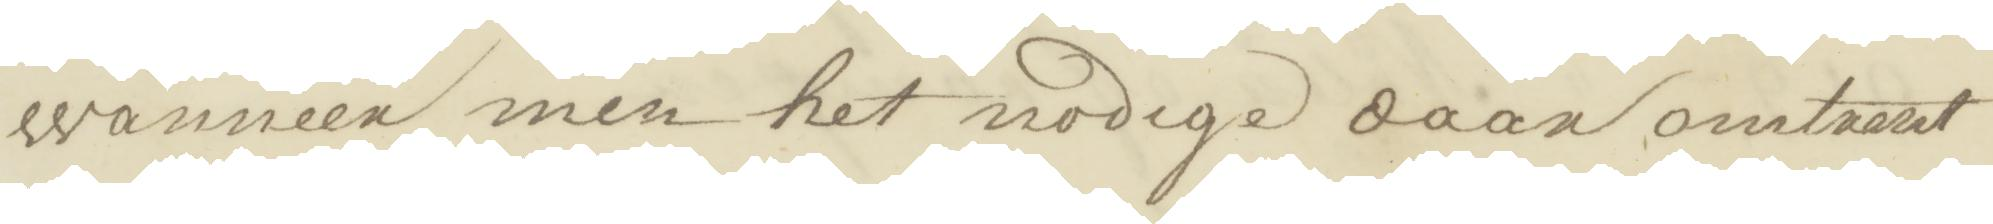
wanneer men het nodige daar omtrent
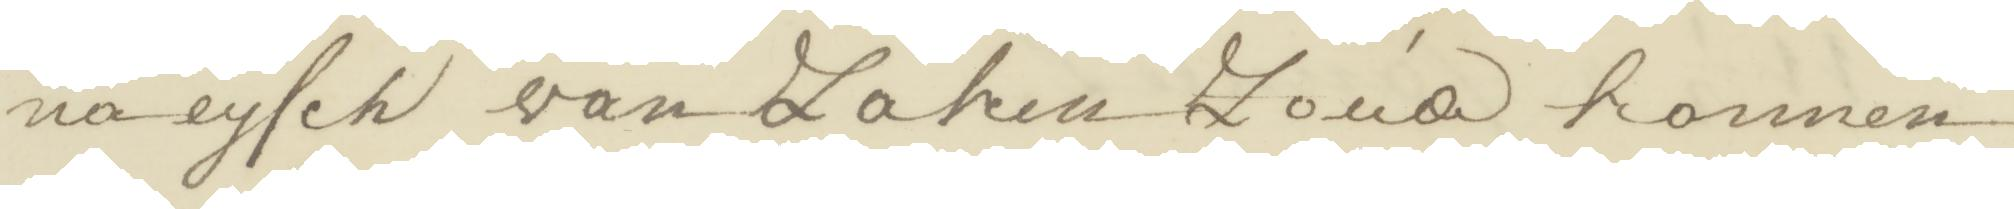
na eijsch van zaken zoude konnen
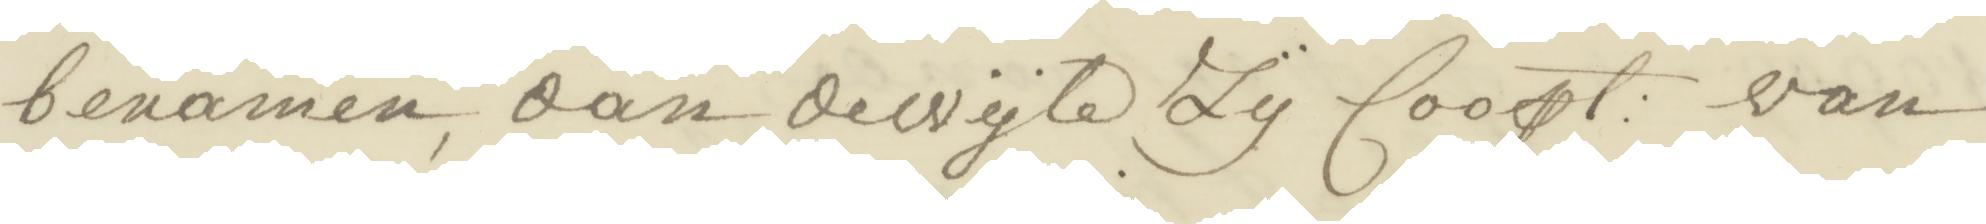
beramen, dan de wijle zij Coopl: van
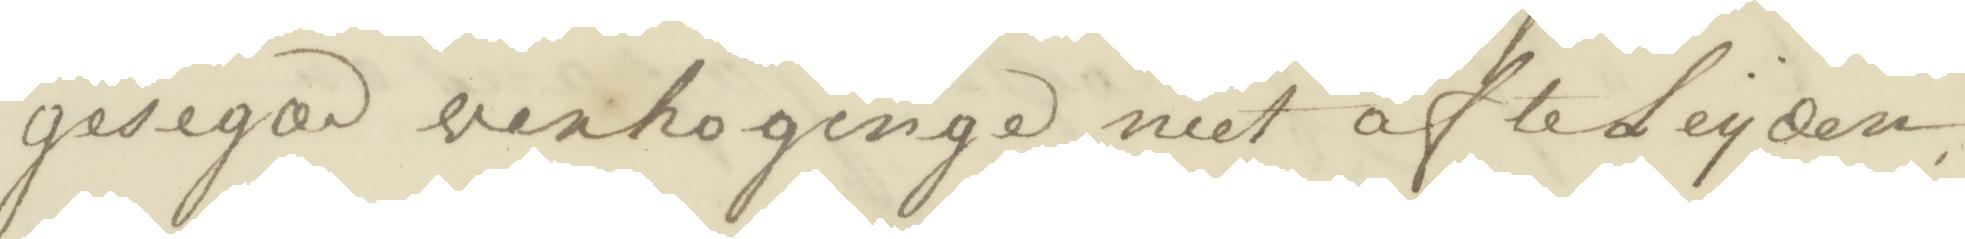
gesegde verhoginge, niet af te leijden,
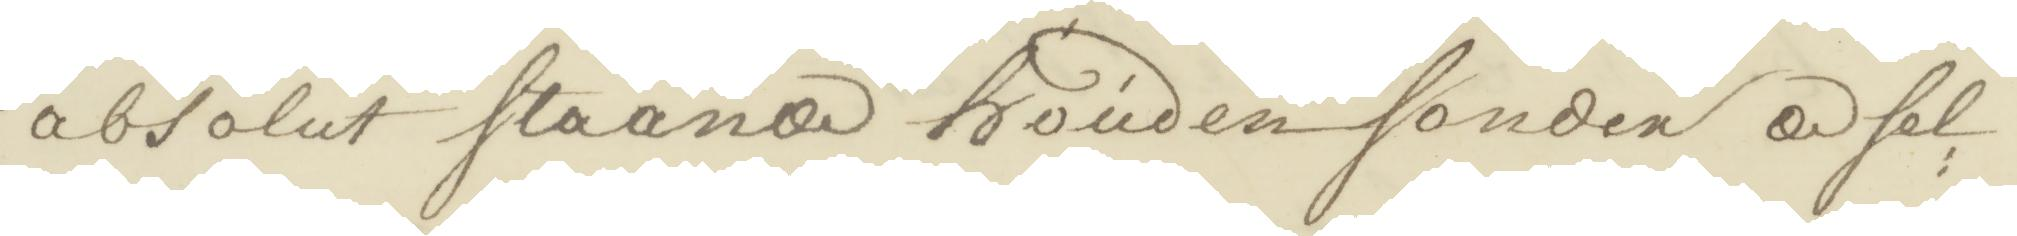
absolut staande houden sonder de sel„
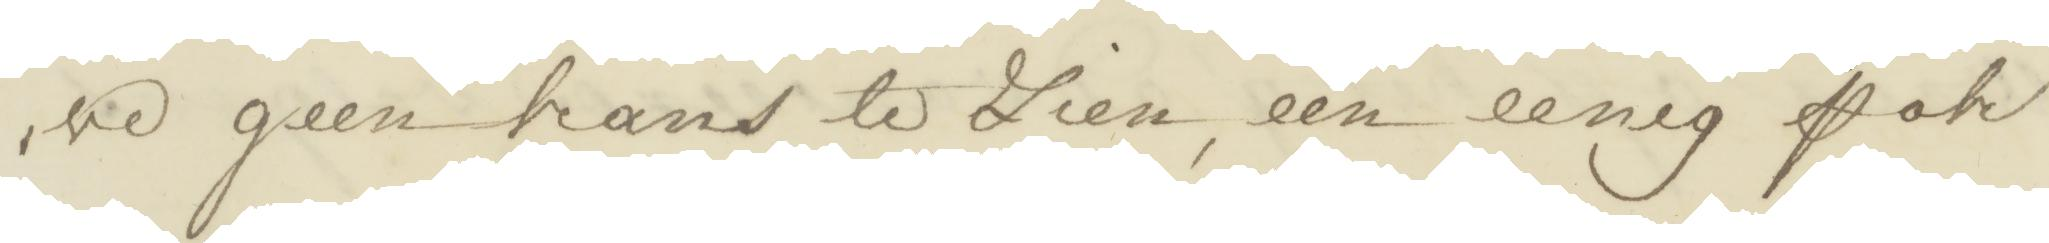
„ve geen kans te zien, een eenig pak
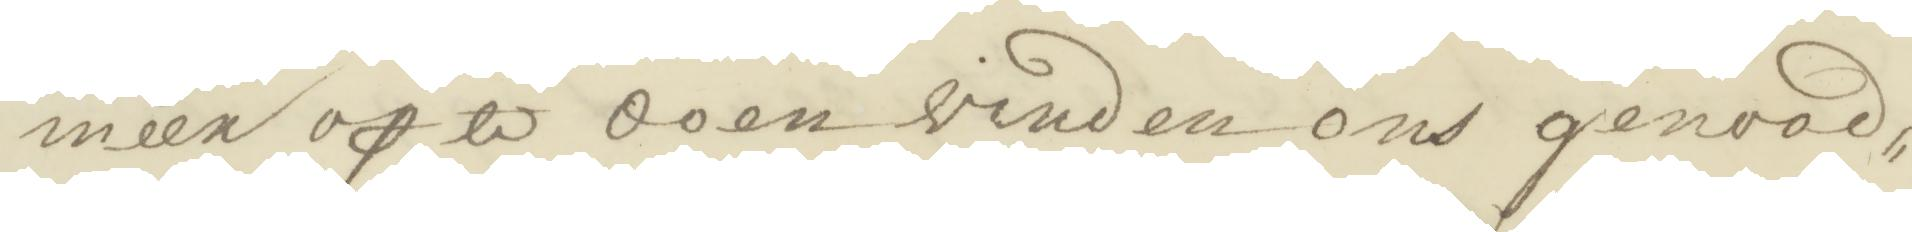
meer op te doen, vinden ons genood
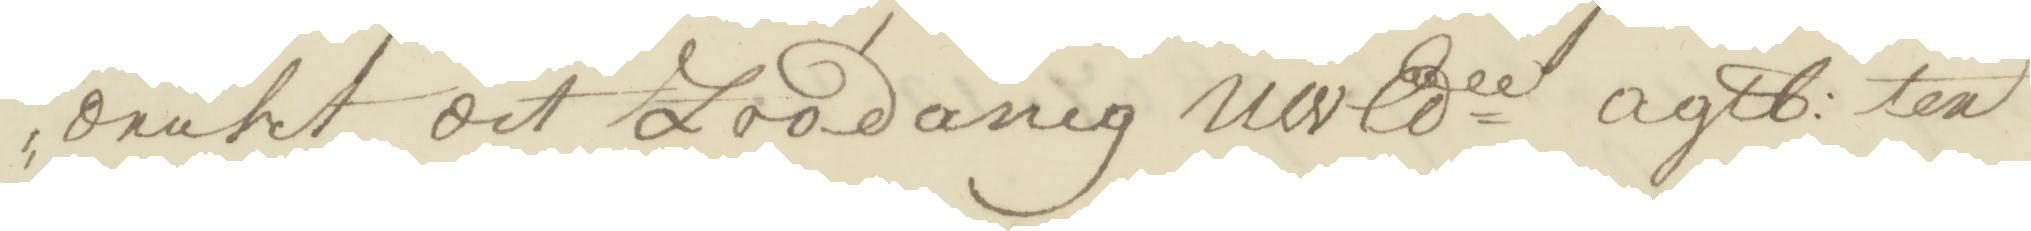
„drukt, dit zoodanig uw Ed=le agtb: ter
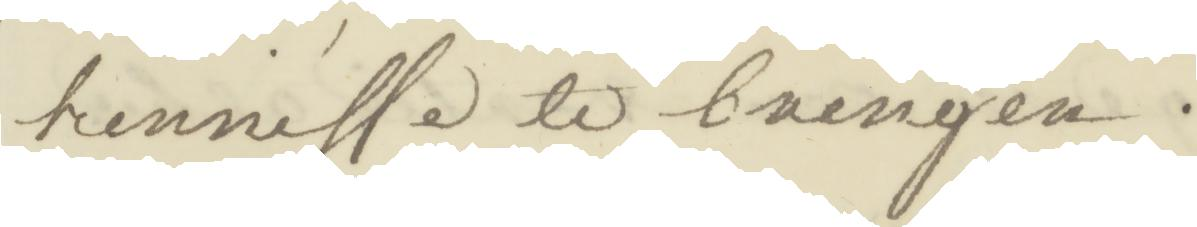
kennisse te brengen
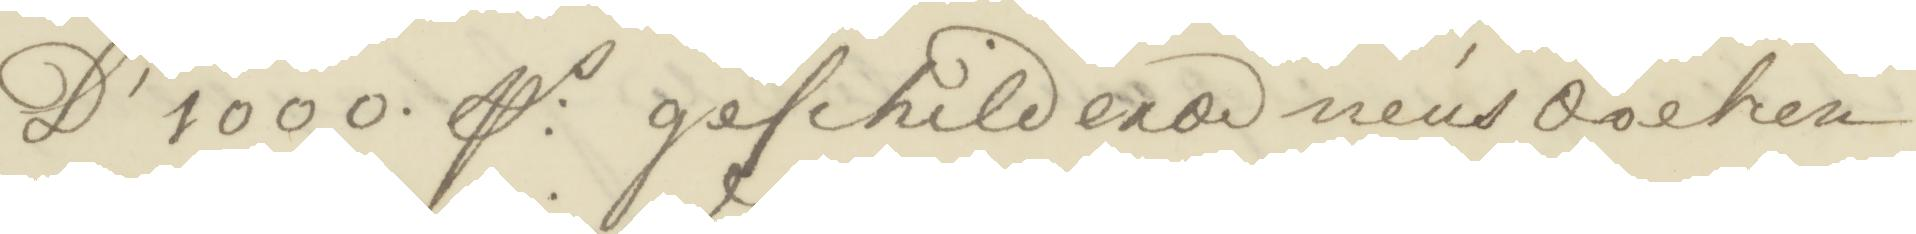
D' 1000. p:s geschilderde neus doeken
